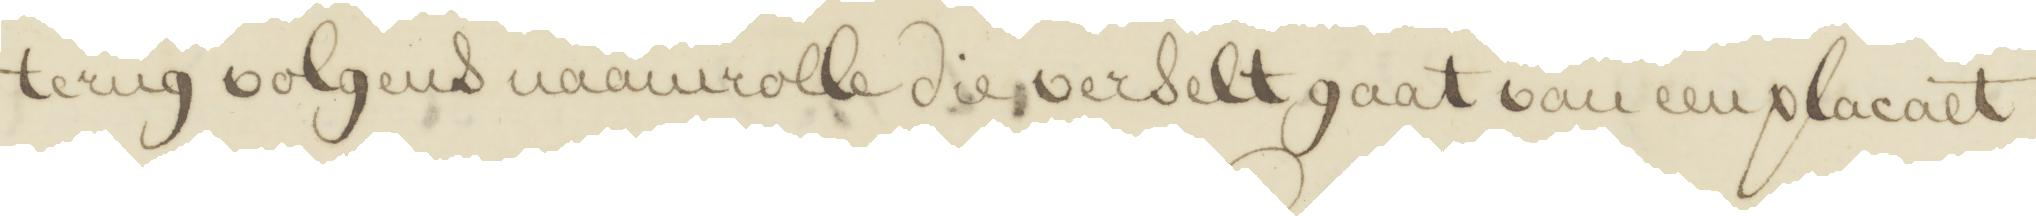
terug volgens naamrolle die verselt gaat van een placaet
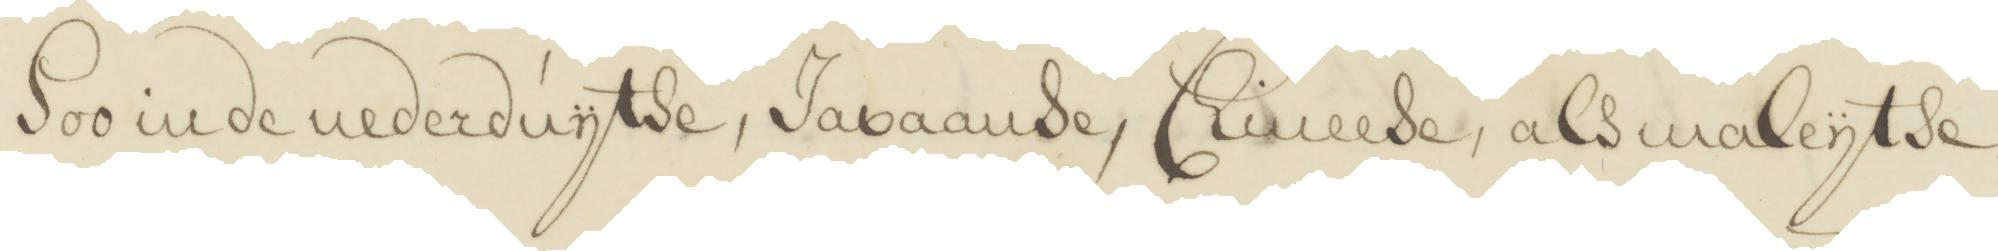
soo in de nederduijtse, Iavaanse, Chineese, als maleijtse
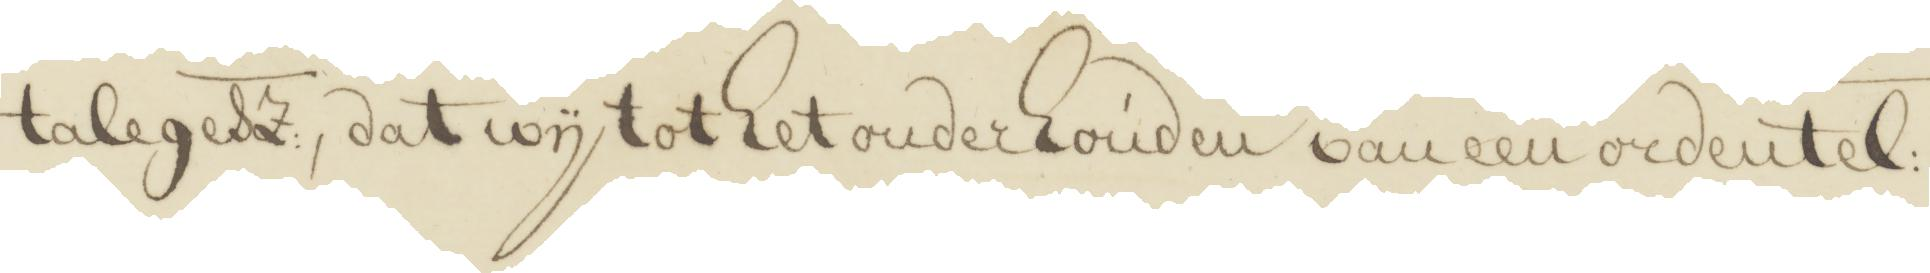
tale gesz:, dat wij tot het onderhouden van een ordentel:
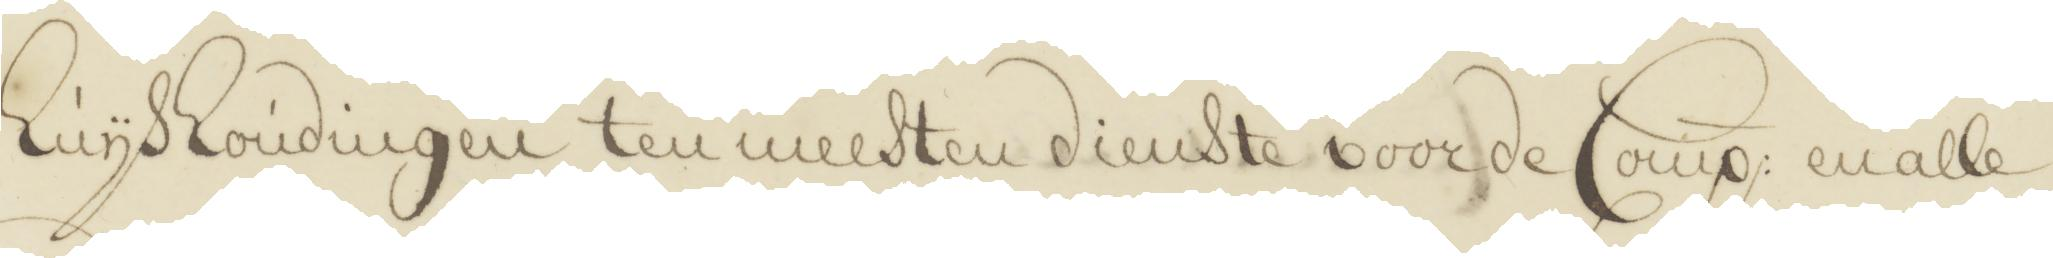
huijshoudingen ten meesten dienste voor de Comp: en alle
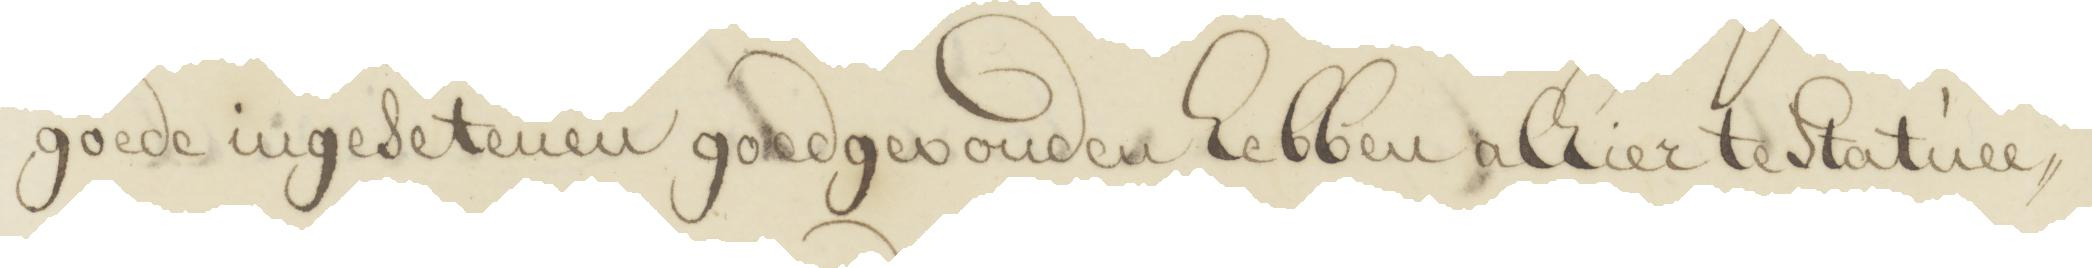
goede ingesetenen goedgevonden hebben alhier te statuee„
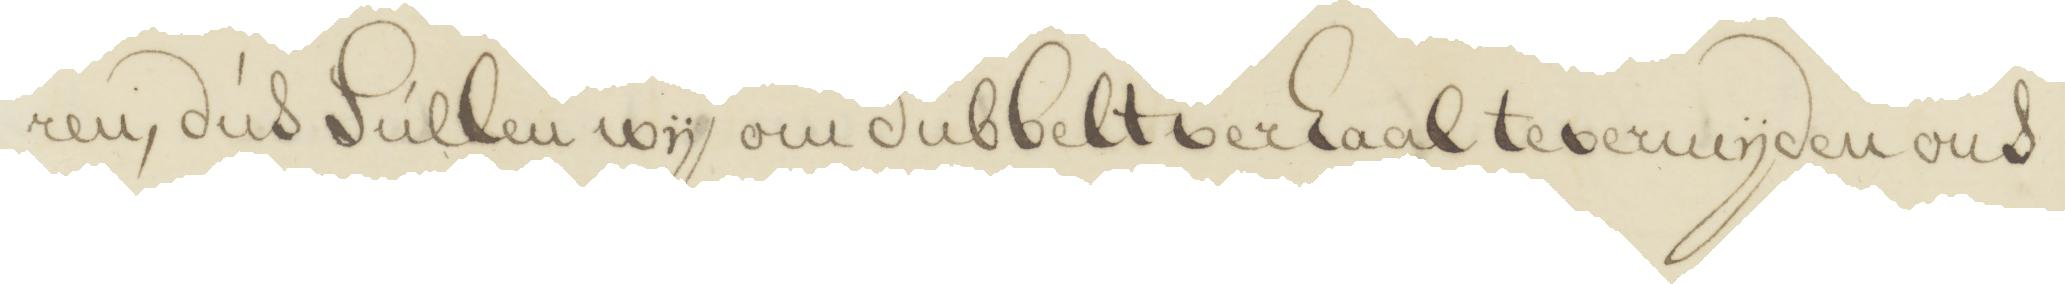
ren, dus sullen wij om dubbelt verhaal te vermijden ons
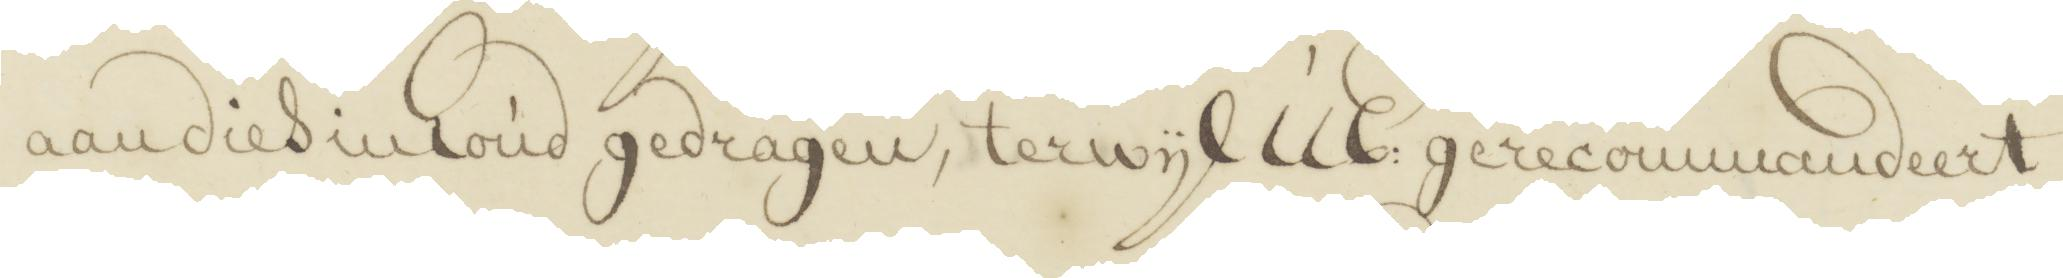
aan dies inhoud gedragen, terwijl UE: gerecommandeert
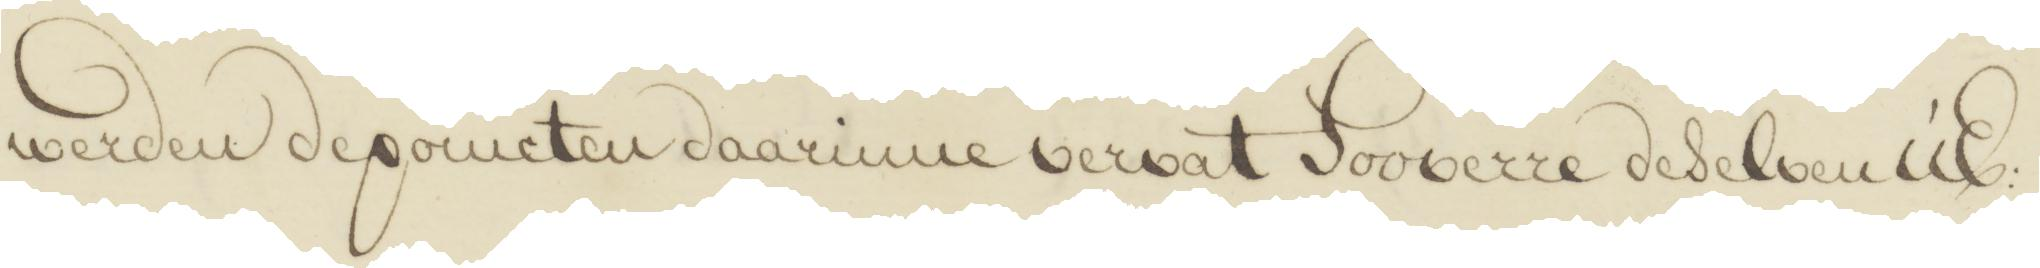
werden depoincten daarinne vervat sooverre deselven UE:
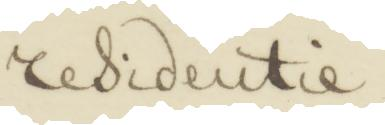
residentie
